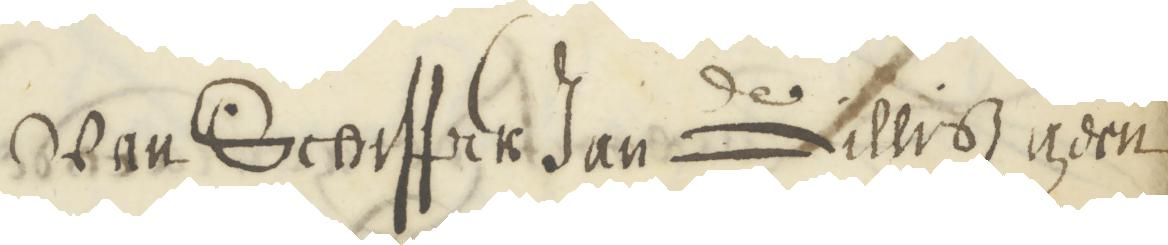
van Schipper Jan Gillisz geen
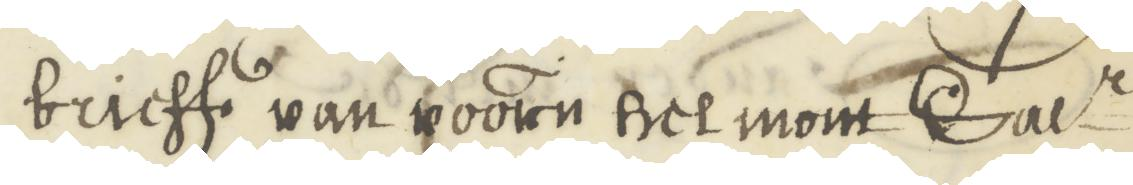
brieff.e van voorn helmont sal=r
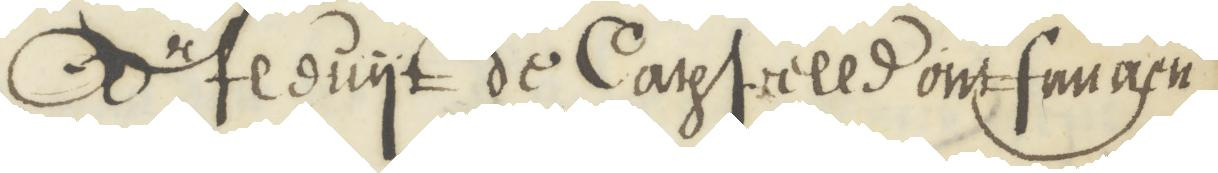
Pr fleuijt de Cappelle ontfangen
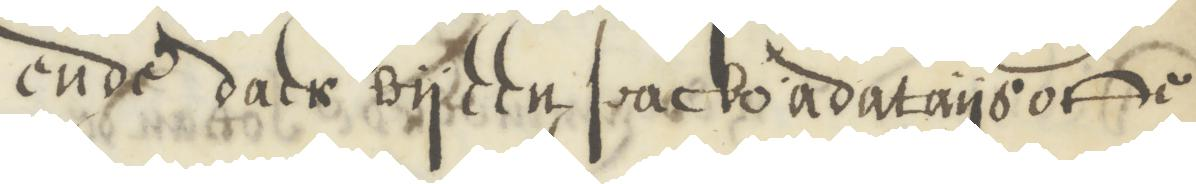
ende daer bij een pack adataijs ofte
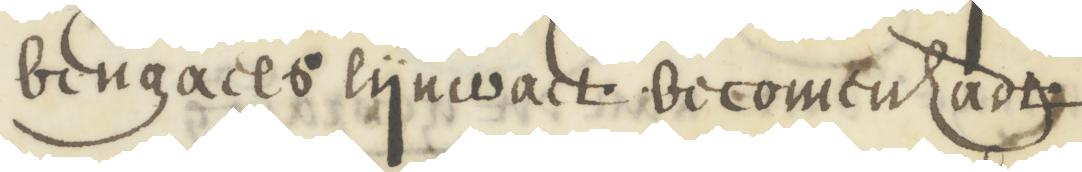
bengaels lijnwaet becomen hadt
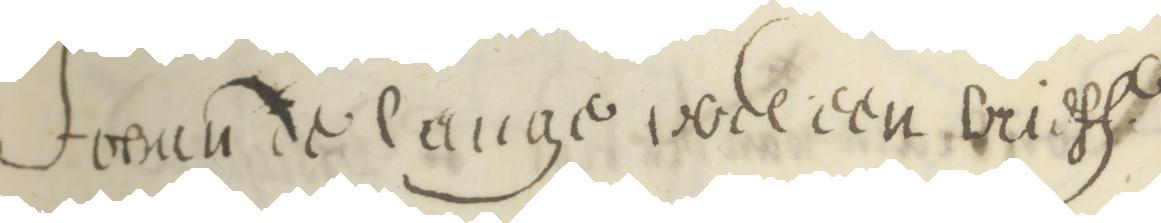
Johan de lange wel een brieff.e
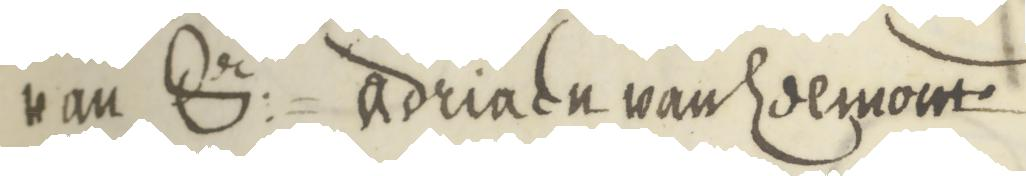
van H:r adriaen van helmont
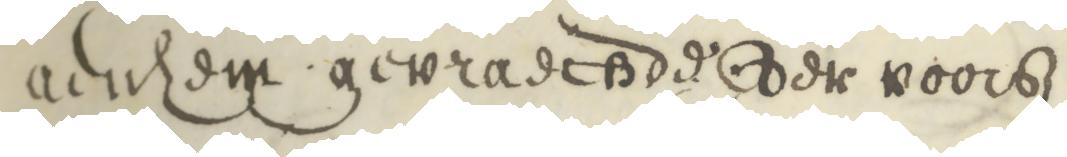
aen hem gevraechde der voorsz
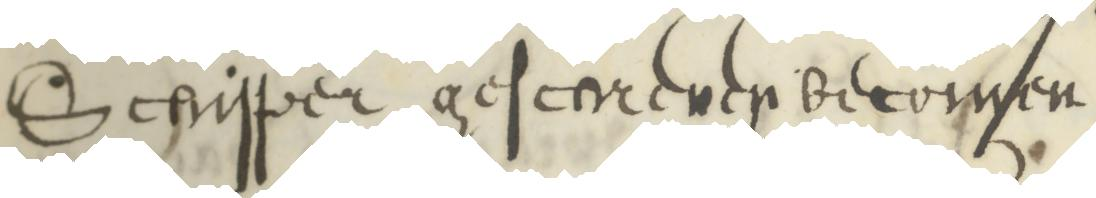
schipper geschreven becomen
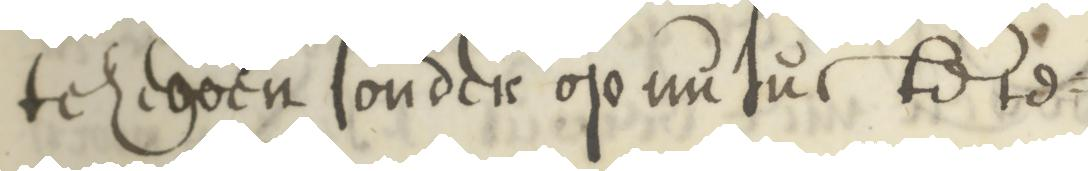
tehegoen sonder op nu fuste te=
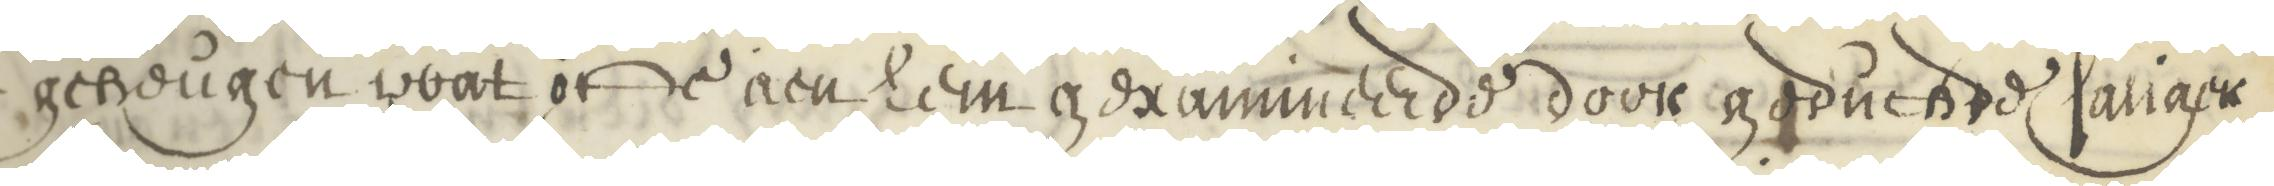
geheugen wat ofte aen hem gexamineerde door geduchde saliger
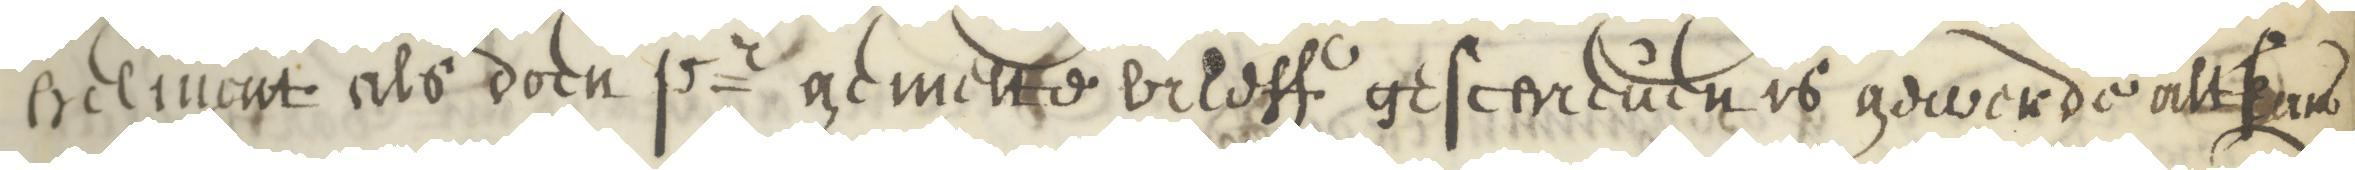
helmont als doen p=r gemelte brieff geschreven is geworde althans
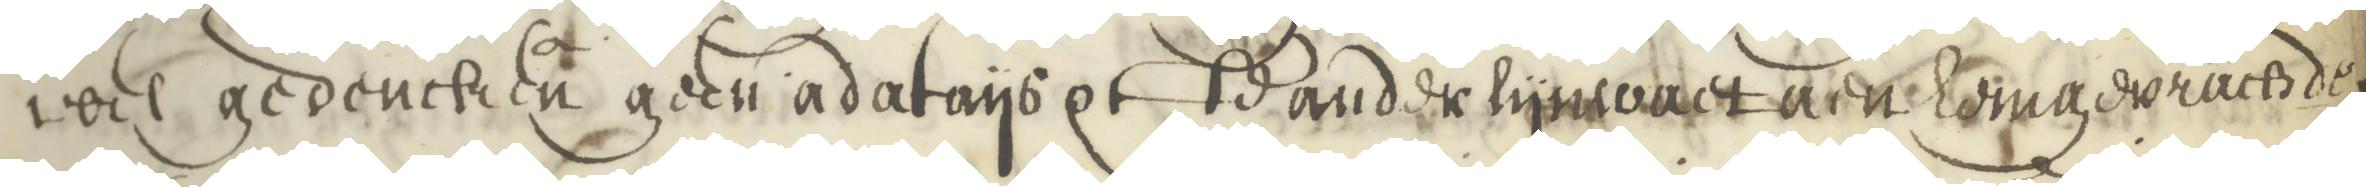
wel gedoncken geen adataijs ofte ander lijnwaet aen hem gevrachde
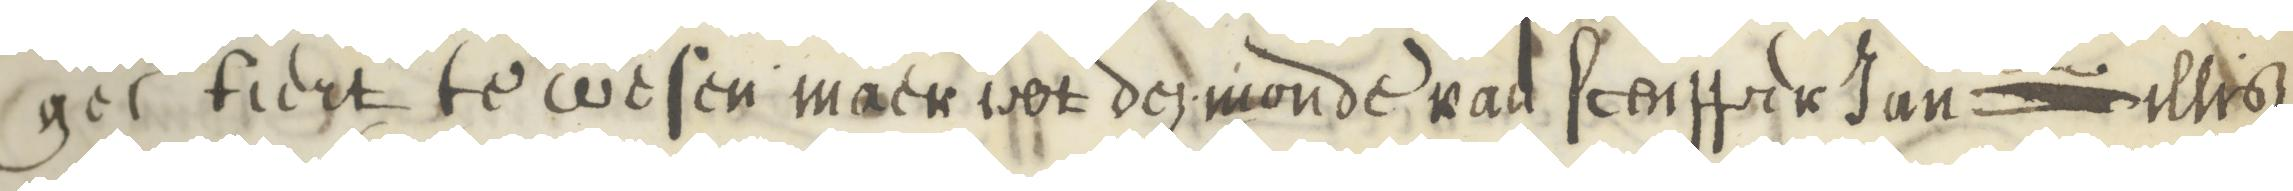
gestiert te wesen maer met den monde van schipper Jan Gillisz
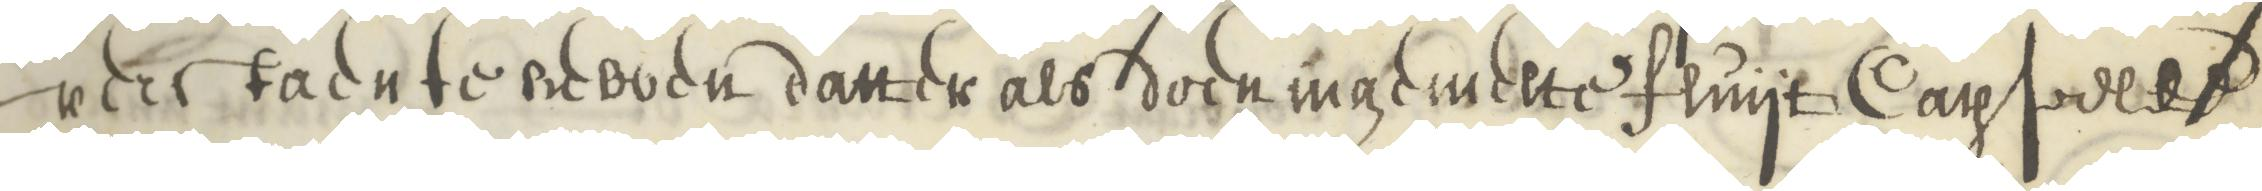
verstaen te hebben datter als doen ingemelte fluijt Cappelde
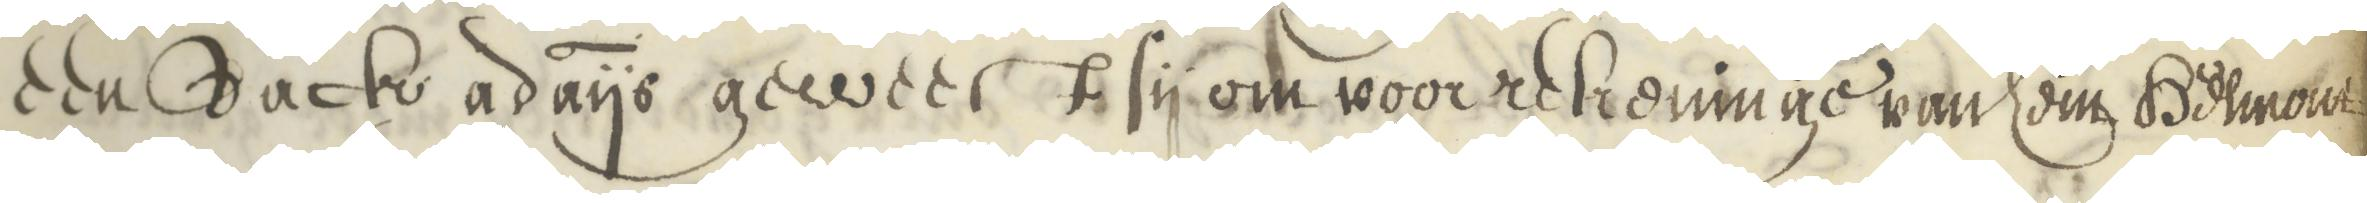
een Sack adaijs geweest sij om voor rekeninge van hem Helmont
